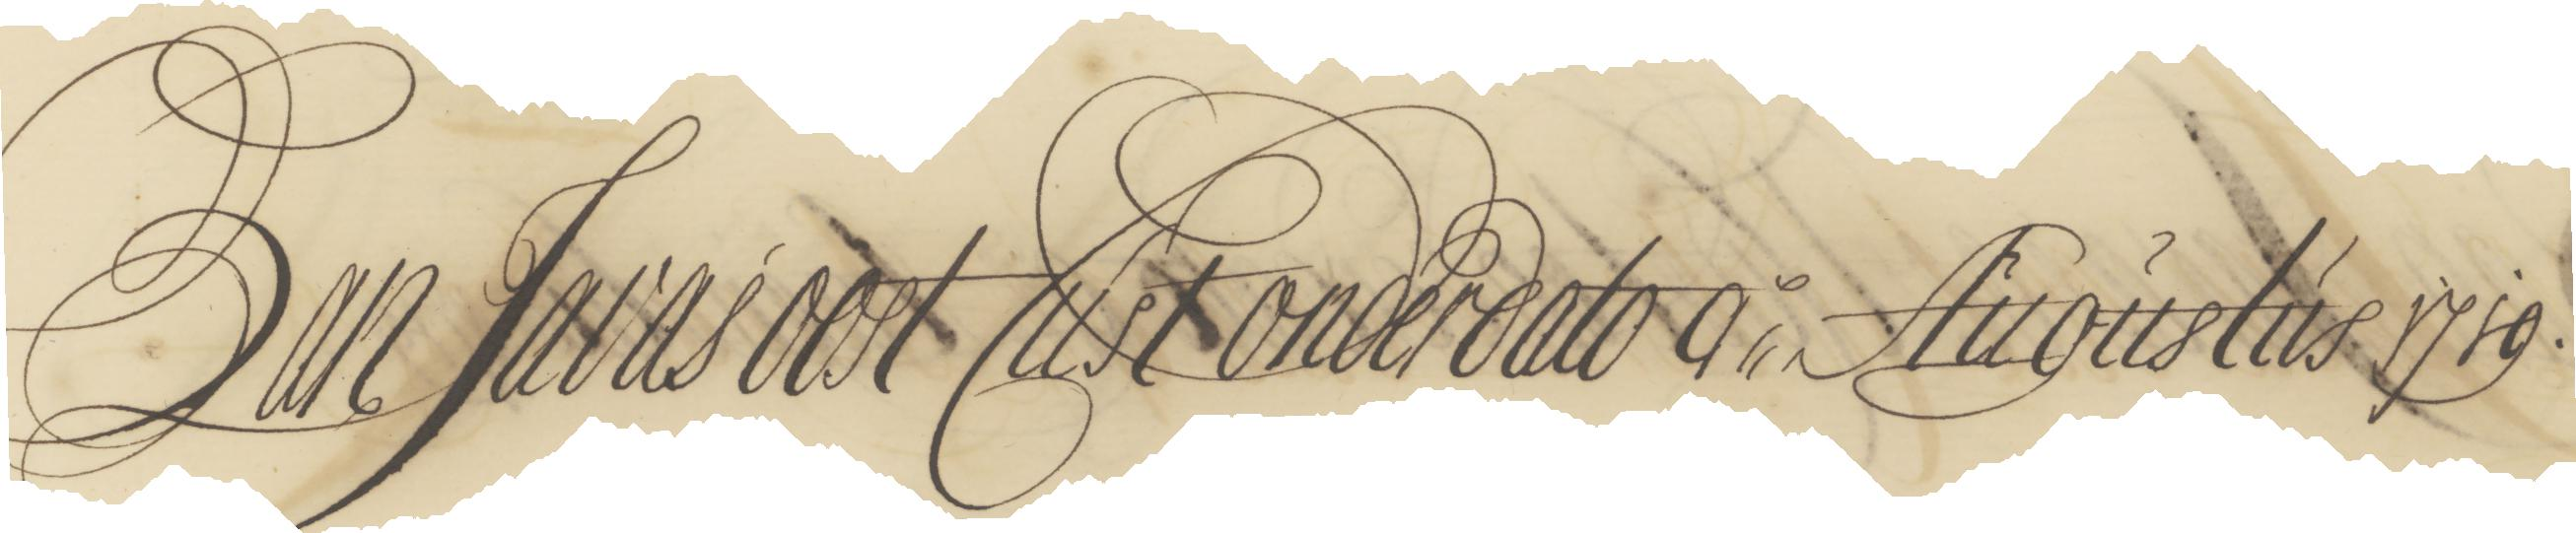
Van Java's oost Cust onder dato 4„o Augustus 1719.
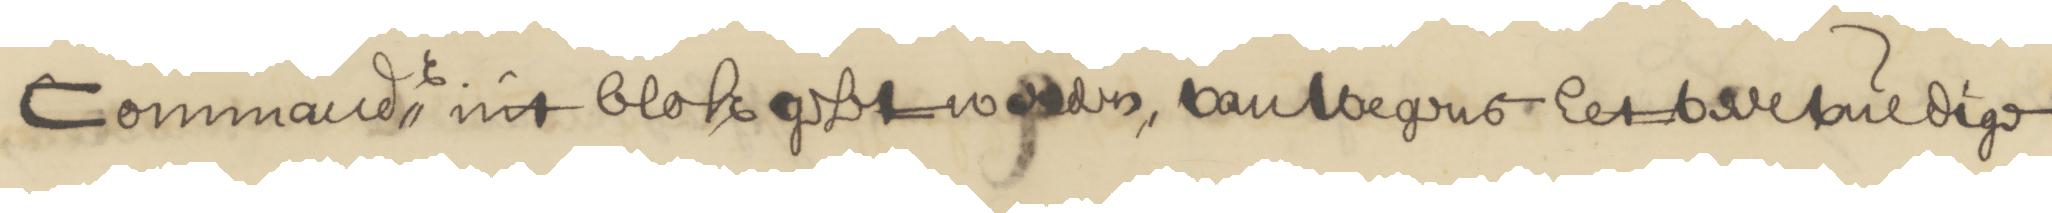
Command„s in't blok geset werden, van wegens het veel vuldige
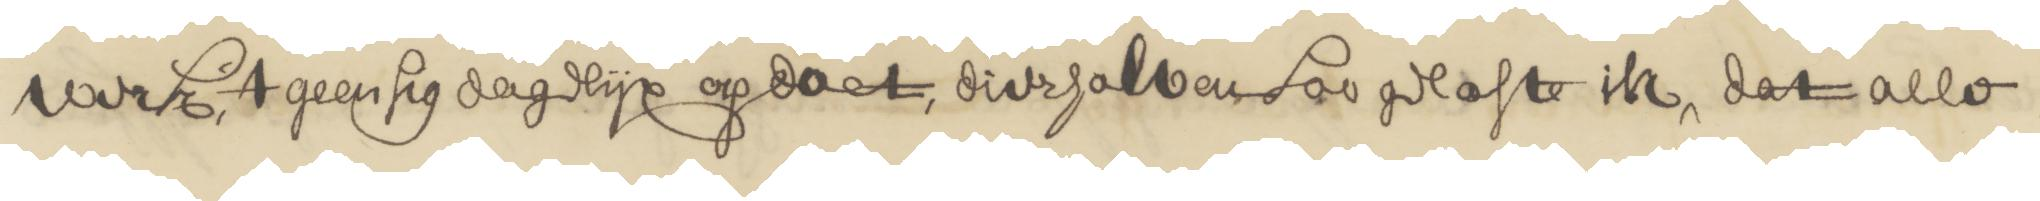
werk, 't geen sig dagelijx opdoet, dierhalven soo gelaste ik, dat alle
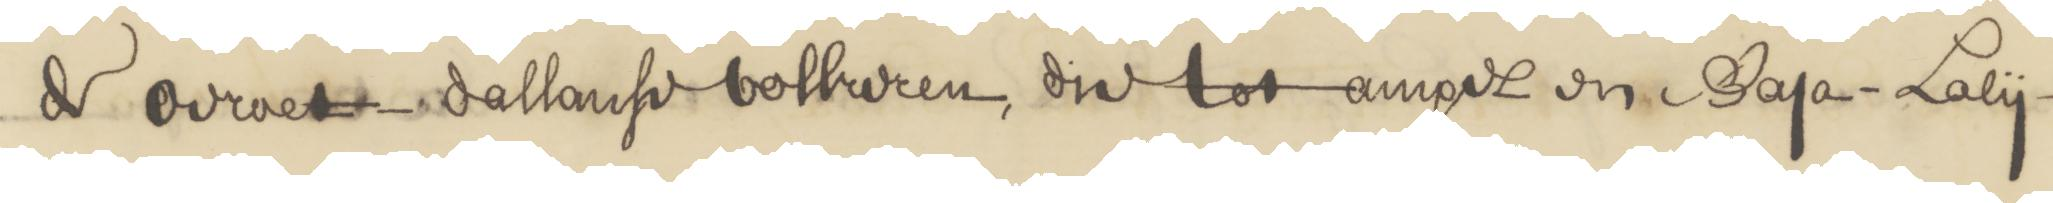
de oeroet-dallanse volkeren, die tot ampel en Baja-Lalij
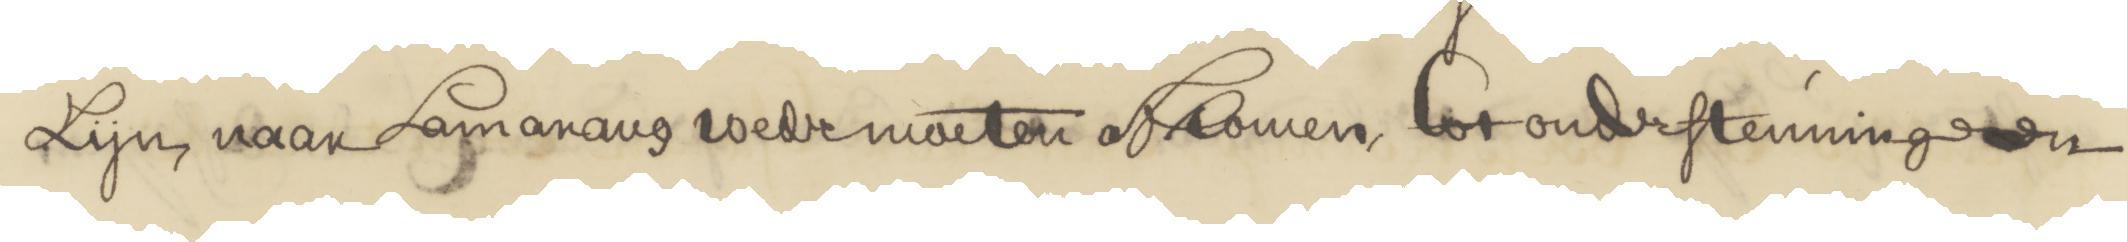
zijn, naar Samarang weder moeten afkomen, tot ondersteuninge en
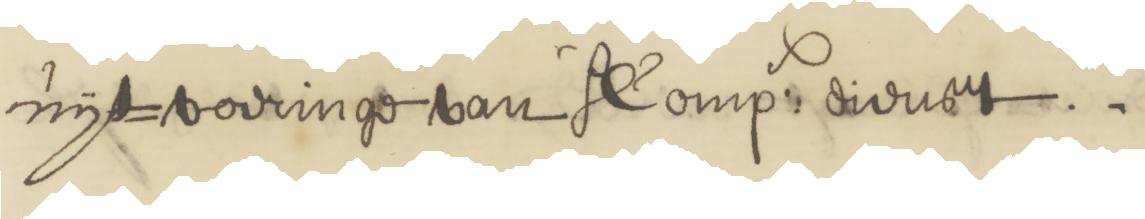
uijtvoeringe van 'sComp:s dienst. -
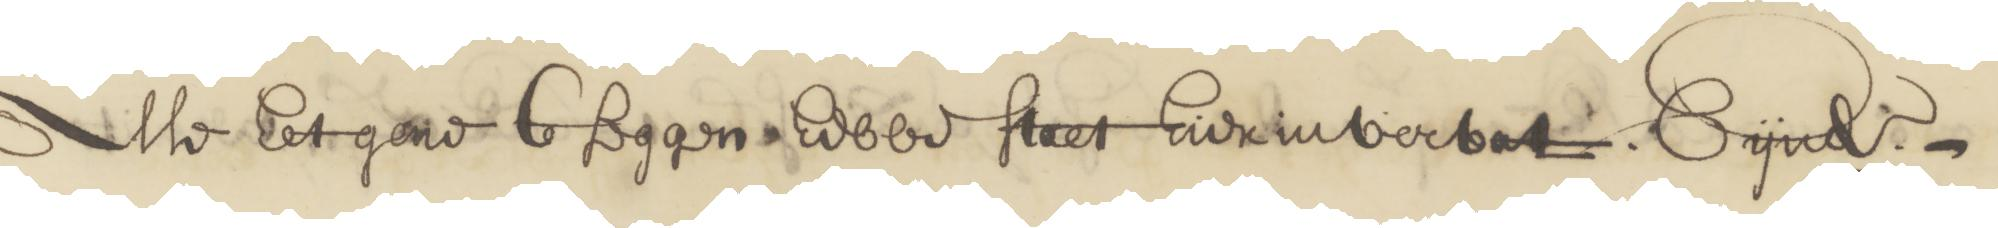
Alle het gene te seggen hebbe staet hier in verbat. Eijnde. —
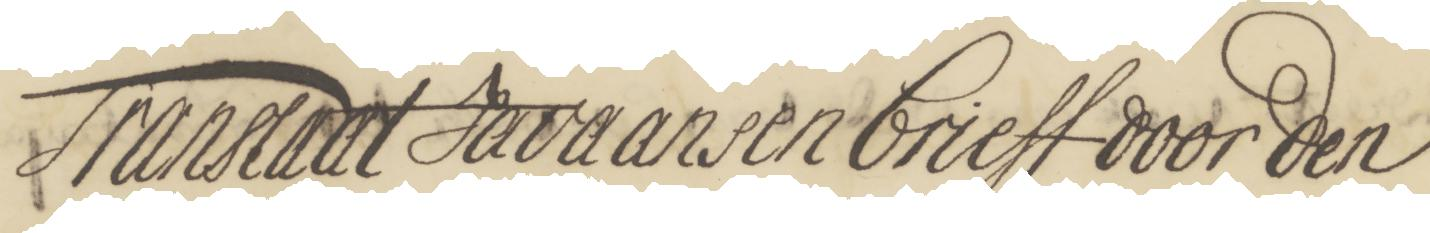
Translaat Javaansen brieff door den
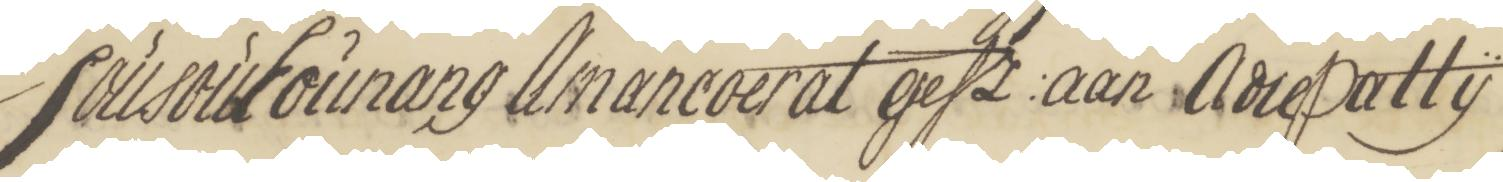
Sousouhounang Amancoerat gesz: aan Adie Pattij
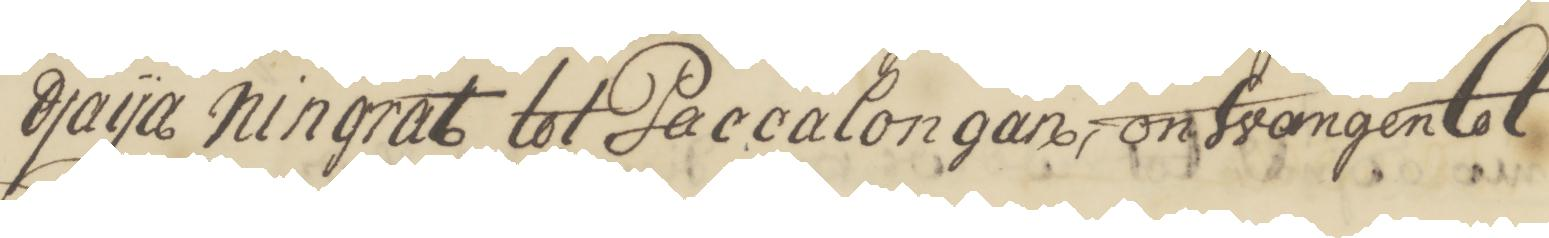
djaija ningrat tot Paccalongan, ontvangen tot
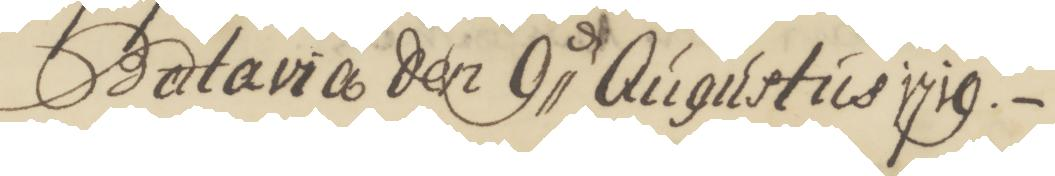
Batavia den 9„en Augustus 1719. —
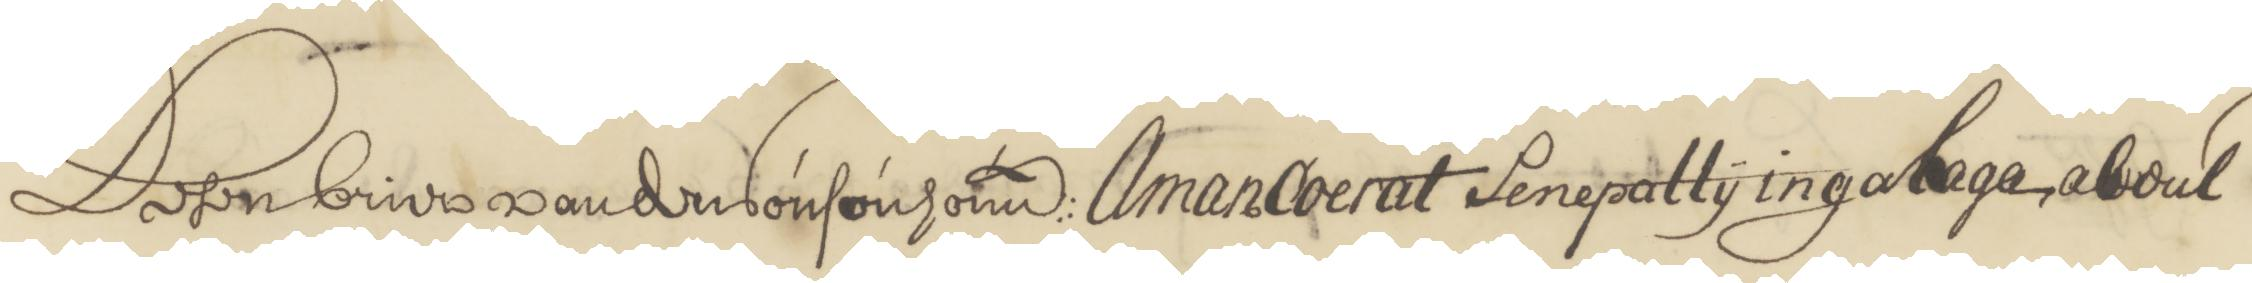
Desen briev van den sousouhoun: Amancoerat senepattij in gabaga, abdul
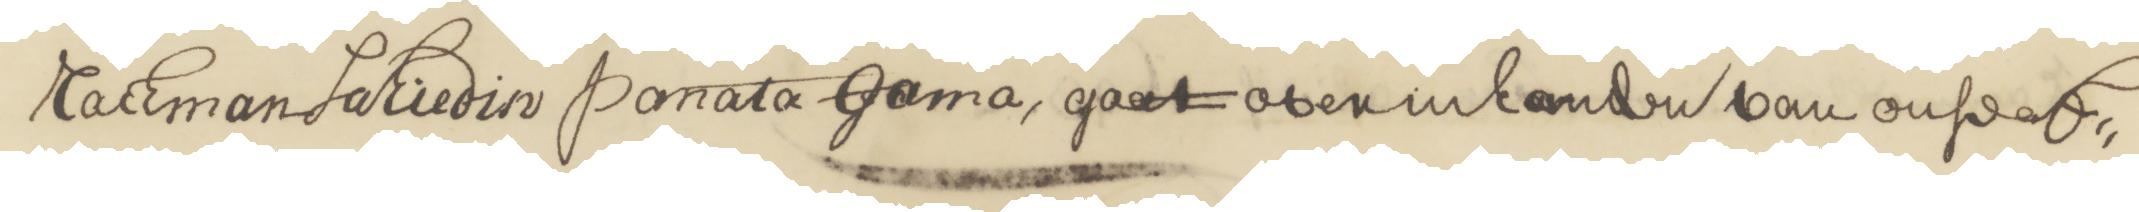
rachman sahiedin Panata Gama, gaat over inhanden van onse af„
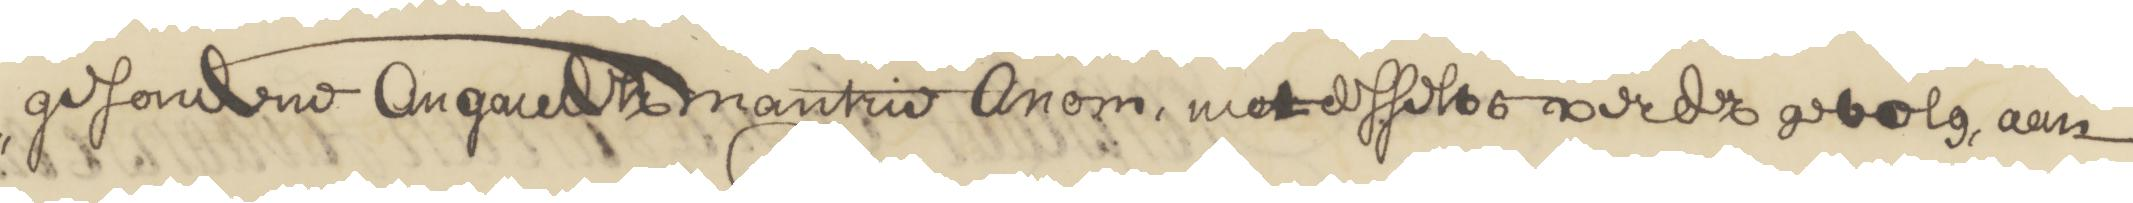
„gesondene Angandek mantrie Anom, met desselvs verder gevolg, aan
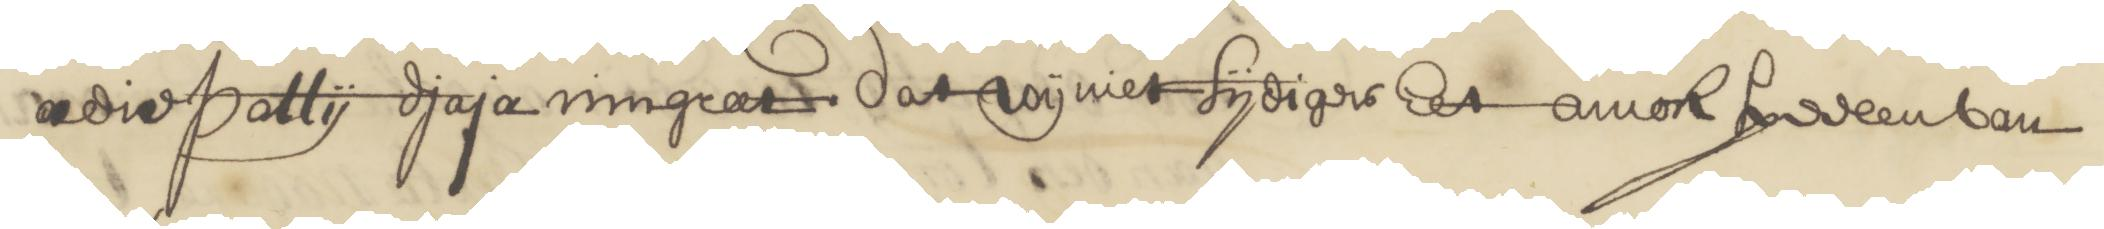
adie pattij djaja ningrat dat wij niet tijdiger het amok speelen van
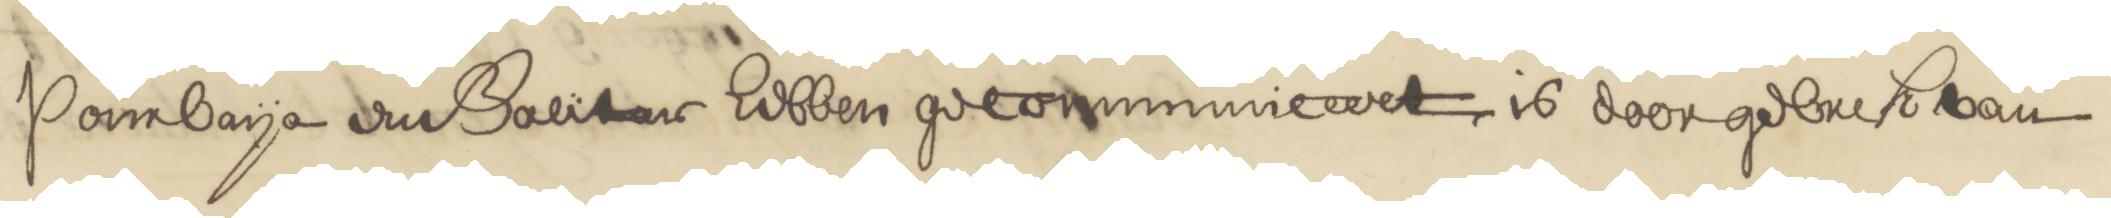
Pourbaija en Balitar hebben gecommuniceert is door gebrek van
